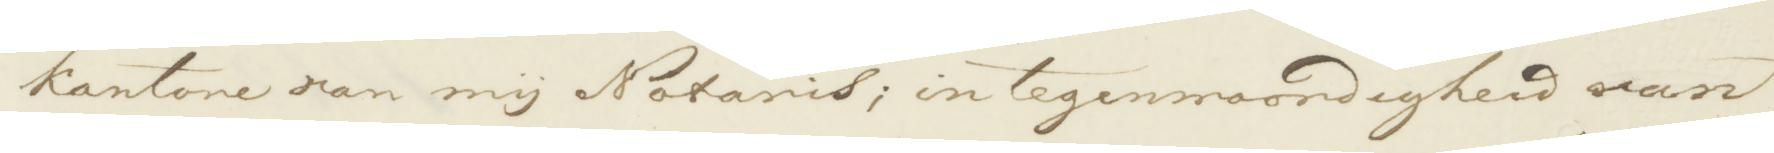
kantore van mij Notaris; in tegenwoordigheid van
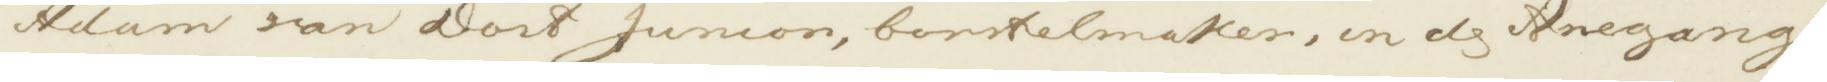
Adam van Dort Junior, borstelmaker, in de Anegang
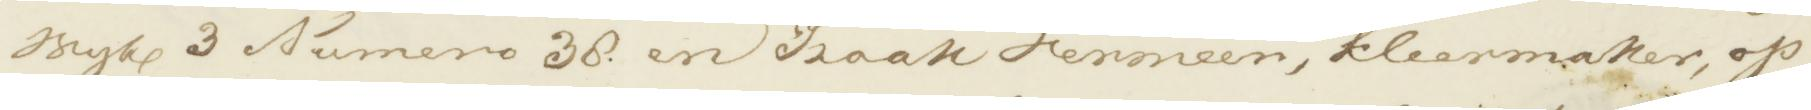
Wyk 3 Numero 38. en Izaak Vermeer, kleermaker, op
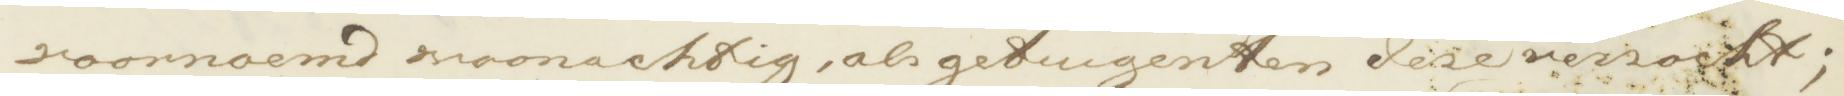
voornoemd woonachtig, als getuigen ten deze verzocht;
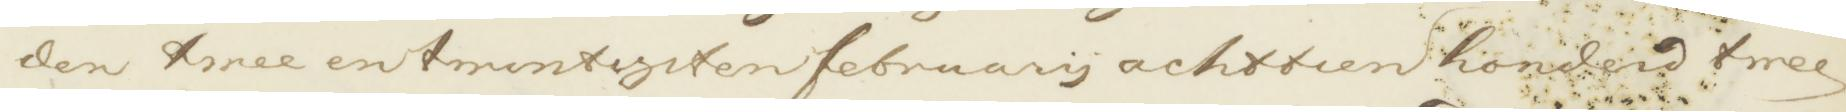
den twee en twintigsten februarij achttien honderd twee
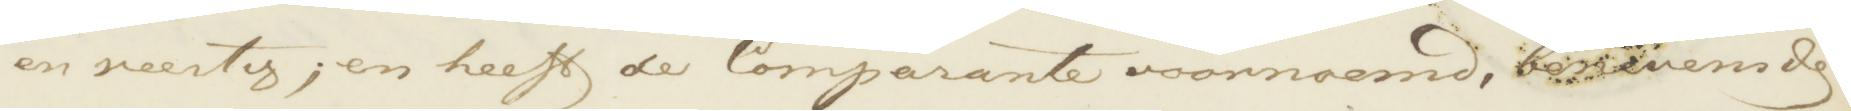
en veertig; en heeft de Comparante voornoemd, benevens de
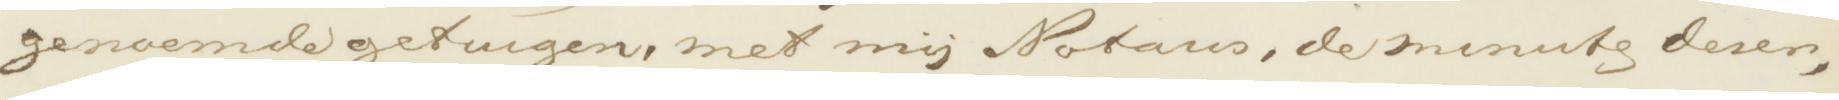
genoemde getuigen, met mij Notaris, de minute dezer,
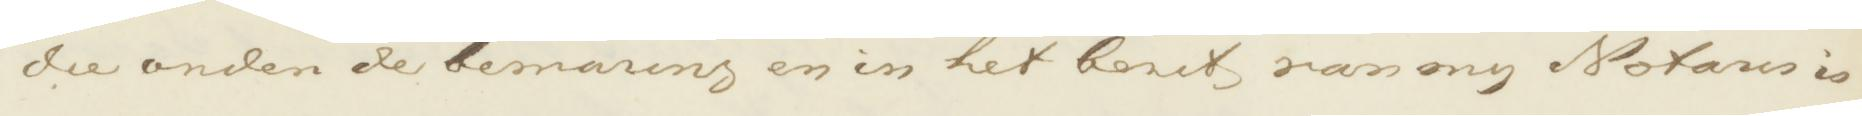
die onder de bewaring en in het bezit van my Notaris is
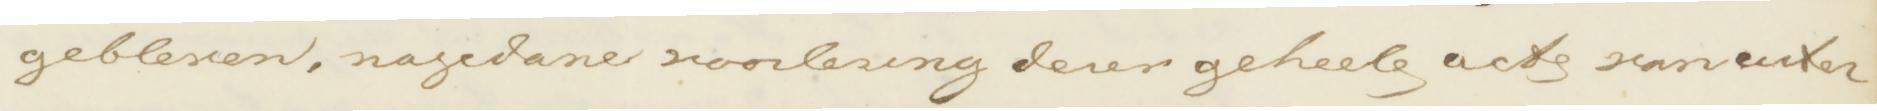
gebleven, nagedane voorlezing dezer geheele acte van uiter
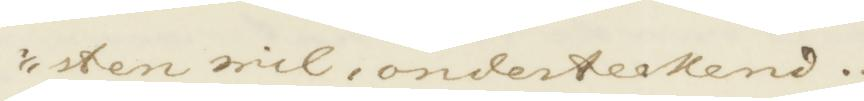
„sten wil, onderteekend.
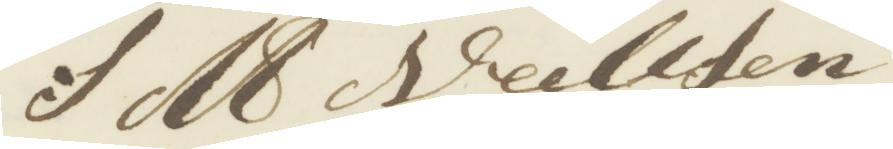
SM Neelisen
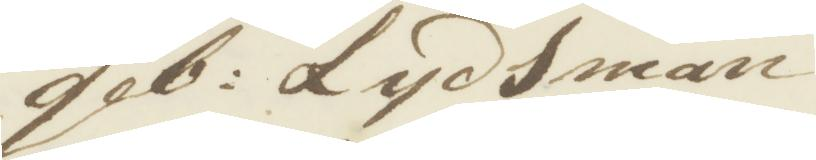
geb: Lydsman
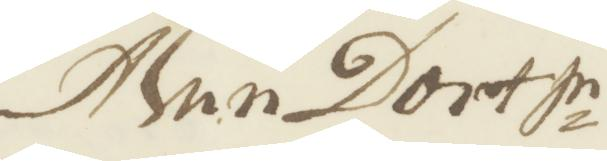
Avan Dortj=r
